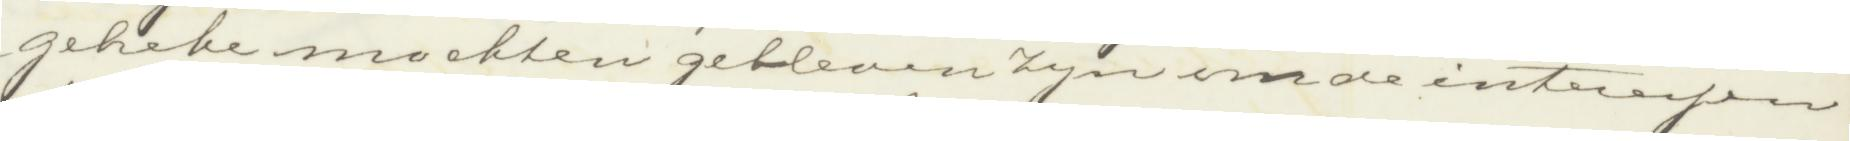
gebreke mochten gebleven zyn om de interessen
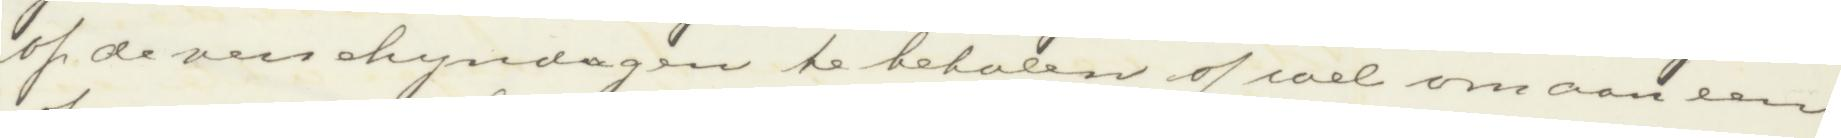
op de verschyndagen te betalen of wel om aan een
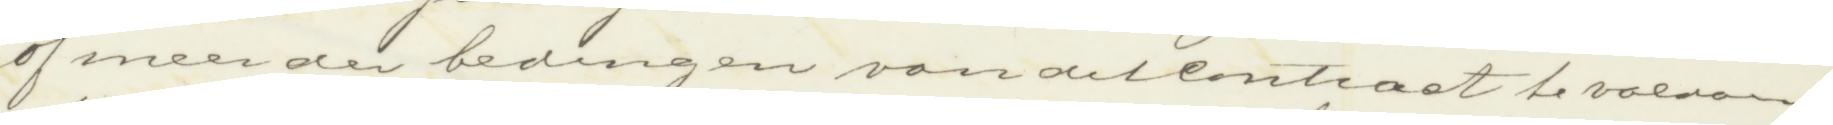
of meer der bedingen van dit contract te voldoen
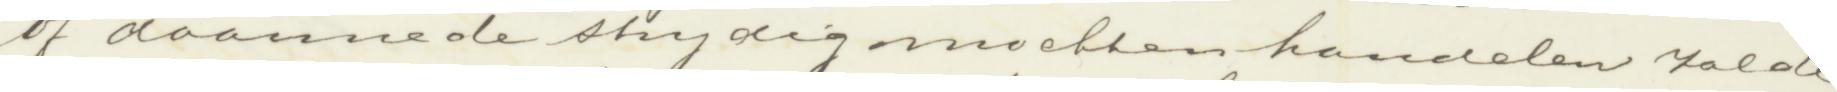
of daarmede strydig mochten handelen zal de
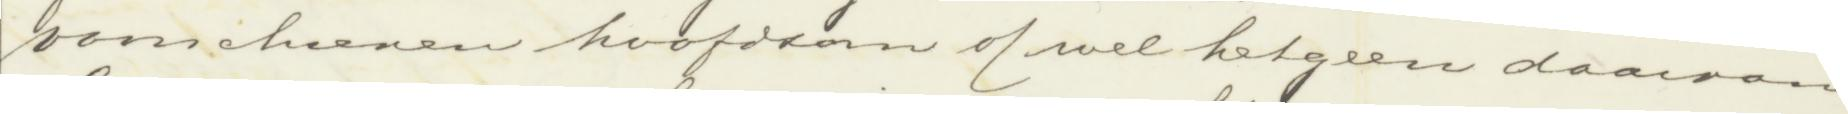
voorschreven hoofdsom of wel hetgeen daarvan
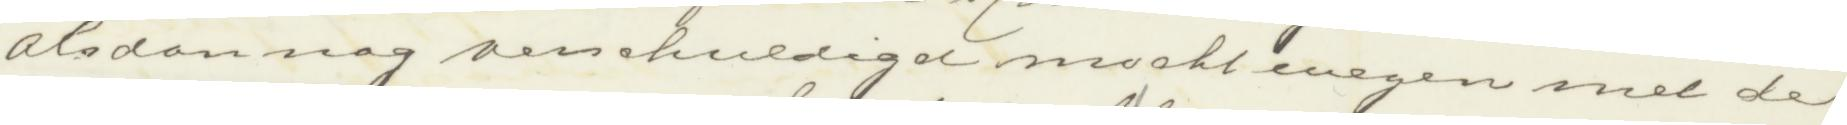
als dan nog verschuldigd mocht wezen met de
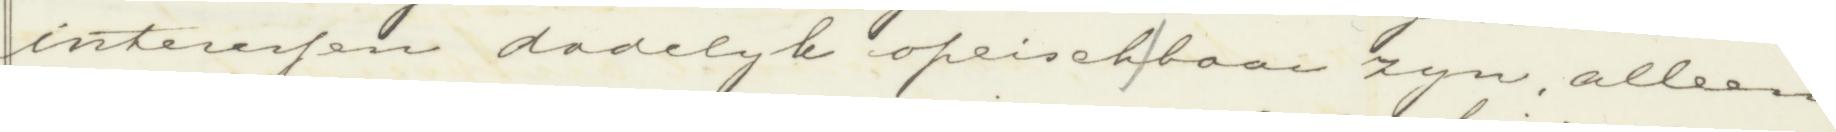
interessen dadelyk opeisch|baar zyn, alleen
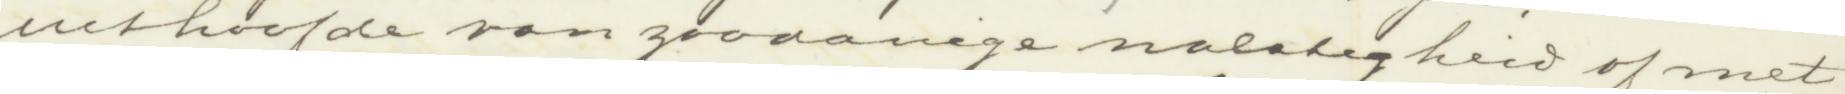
uithoofde van zoodanige nalatigheid of met
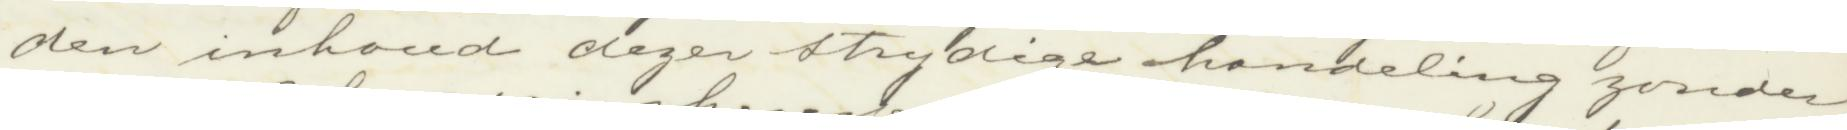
den inhoud dezer strydige handeling zonder
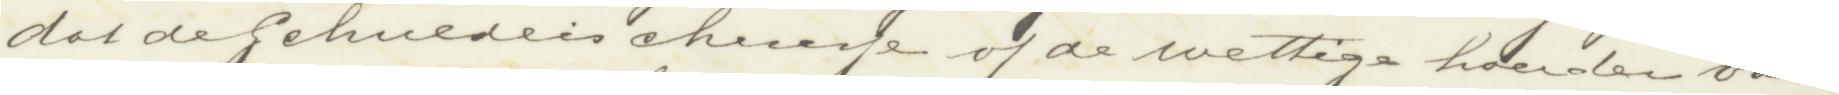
dat de Schuldeischeresse of de wettige houder van
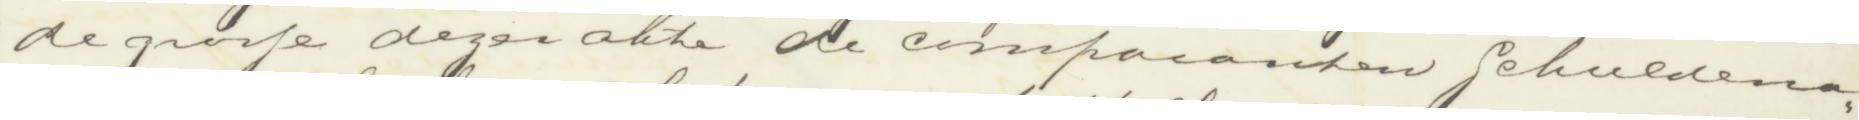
de grosse dezer akte de comparanten schuldena„
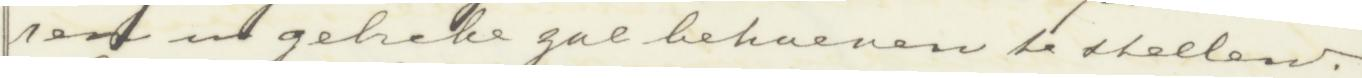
ren in gebreke zal behoeven te stellen.
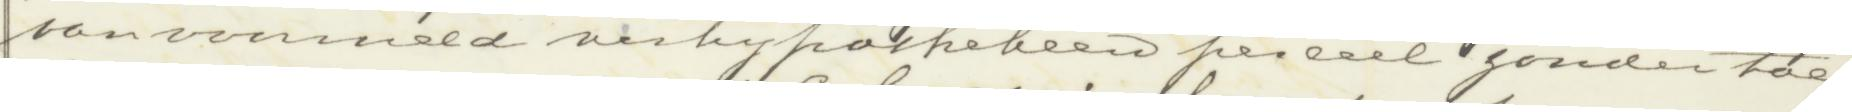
van voormeld verhypothekeerd perceel zonder toe
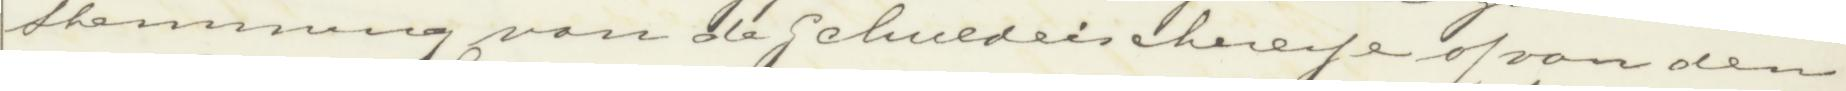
stemming van de Schuldeischeresse of van den
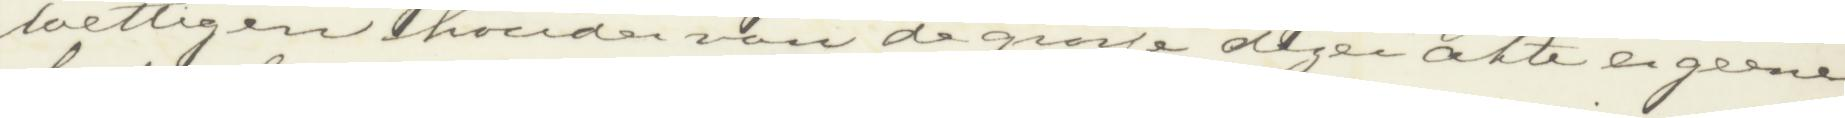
wettigen houder van de grosse dezer akte er geene
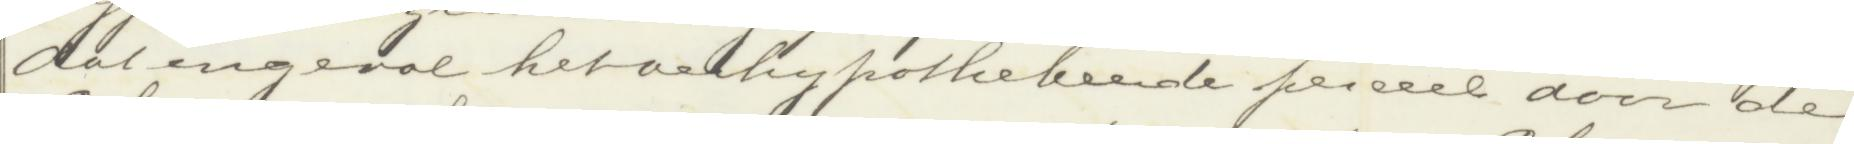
dat ingeval het verhypothekeerde perceel door de
